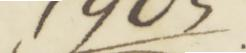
1905:
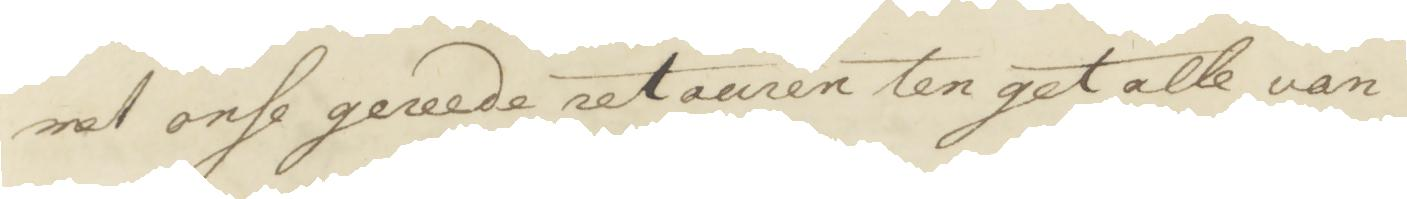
met onse gereede retouren ten getalle van
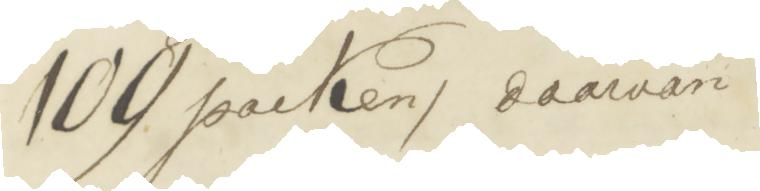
109 packen, daarvan
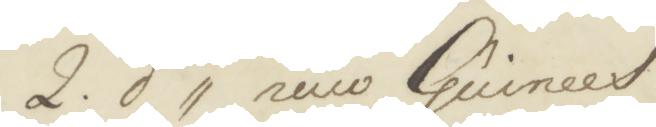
2. d„os ruw Guinees
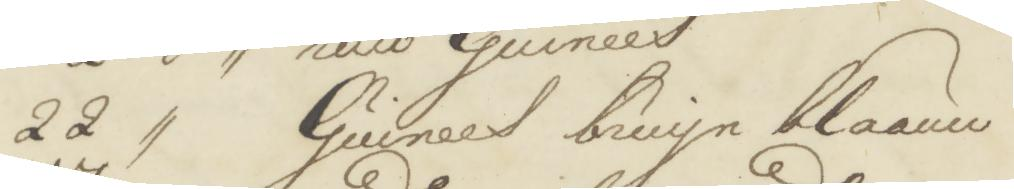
22 „ Guinees bruijn blaauw
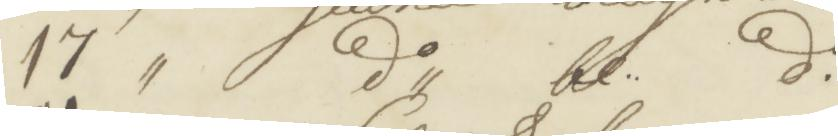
17 „ d„o bl„ d.o
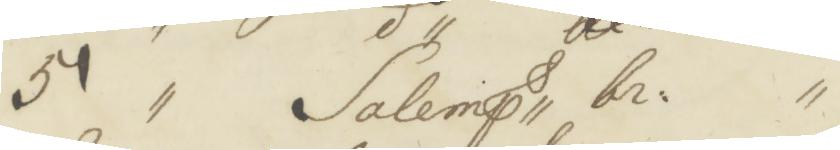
51 „ salemp„s br: „
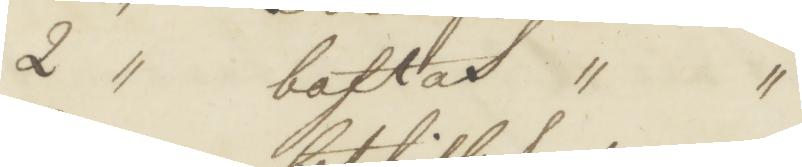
2 „ baftas „ „
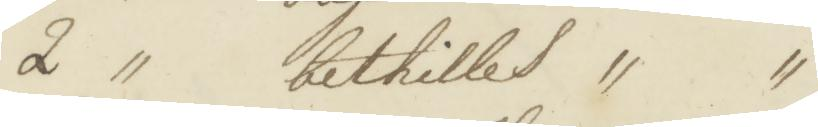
2 „ bethilles „ „
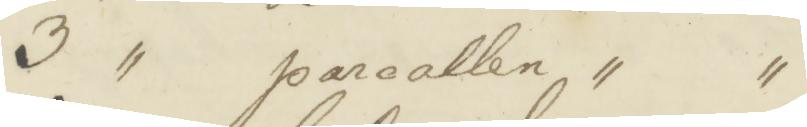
3 „ parcallen „ „
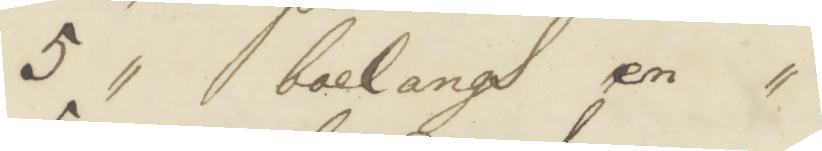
5 „ boelangs en „
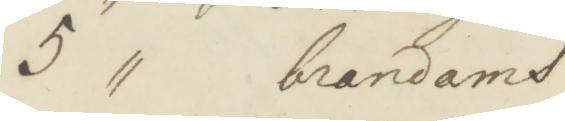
5 „ brandams
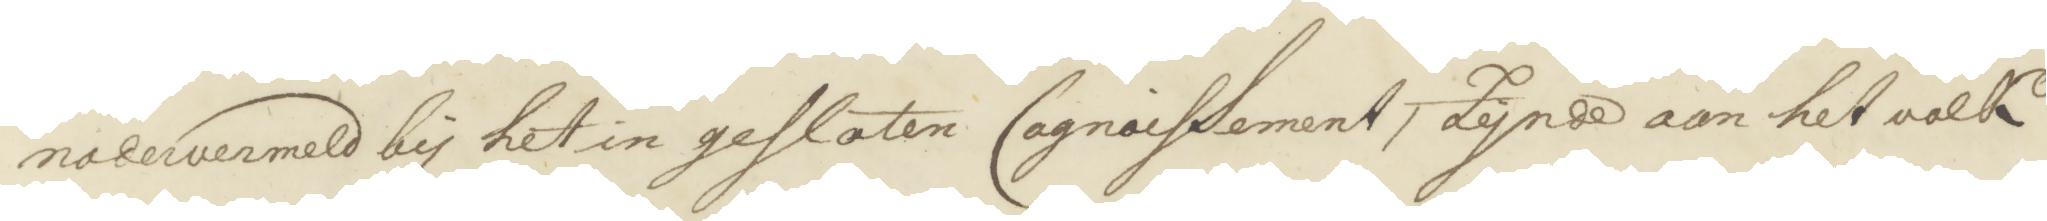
nadervermeld bij het in gesloten Cognoissement, zijnde aan het volk
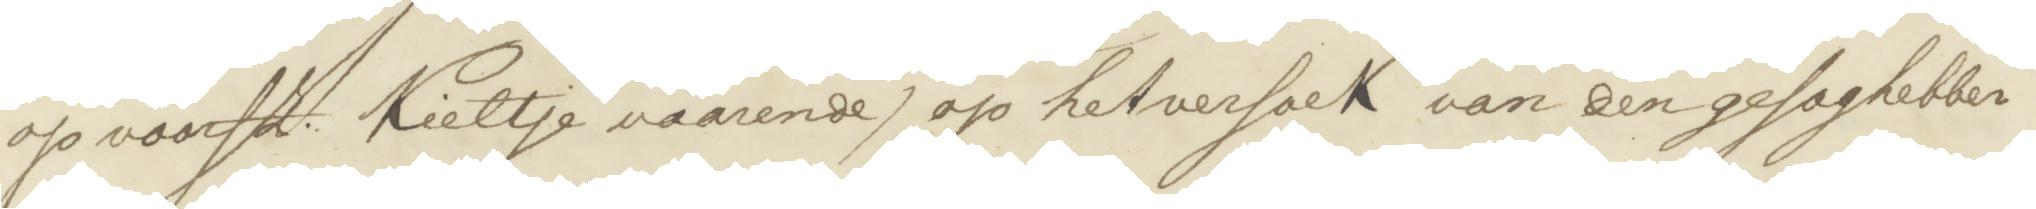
op voorsz: kieltje vaarende, op het versoek van den gesaghebber
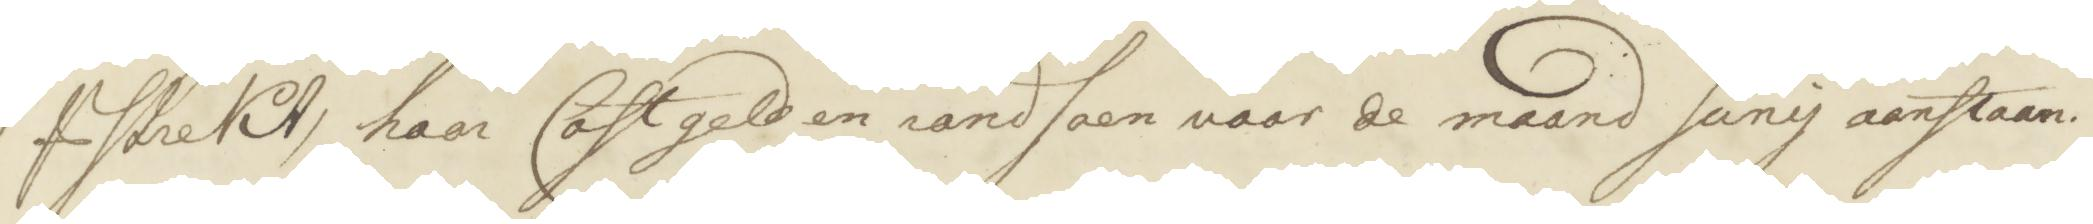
verstrekt, haar Costgeld en randsoen voor de maand Junij aanstaan.
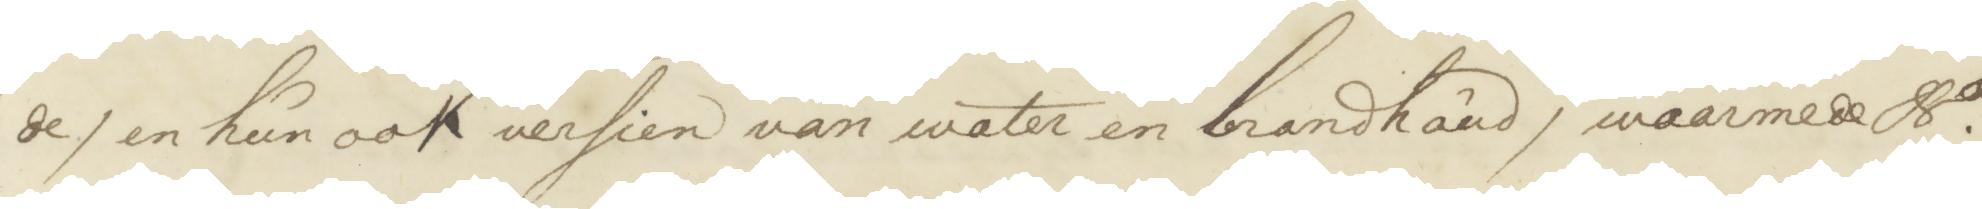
de, en hun ook versien van water en brandhoud, waarmede &.a
